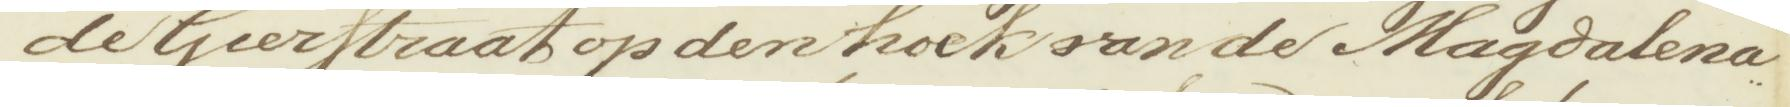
de Gierstraat op den hoek van de Magdalena„
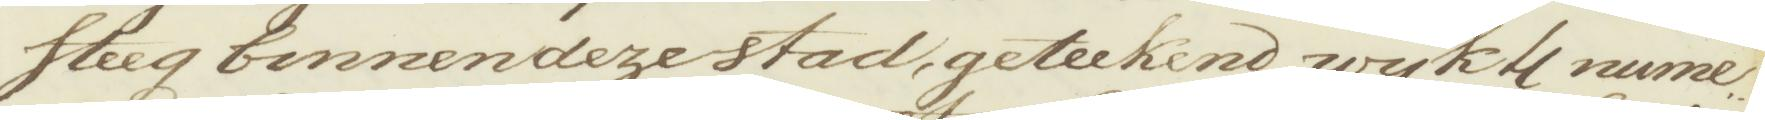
steeg binnen deze stad, geteekend wyk 4 nume„
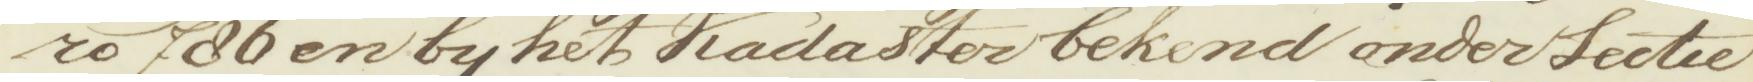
ro 786 en by het Kadaster bekend onder Sectie
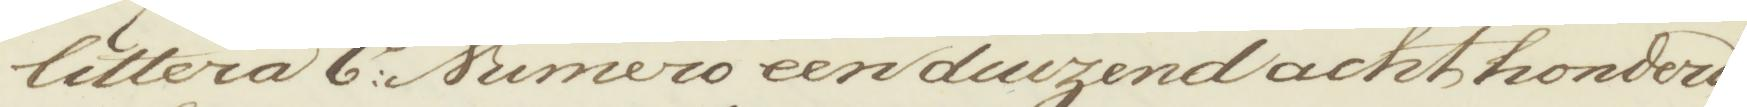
littera C: Numero een duizend acht honderd
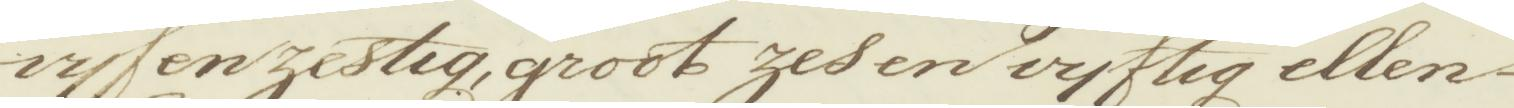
vyf en zestig, groot zes en vyftig ellen
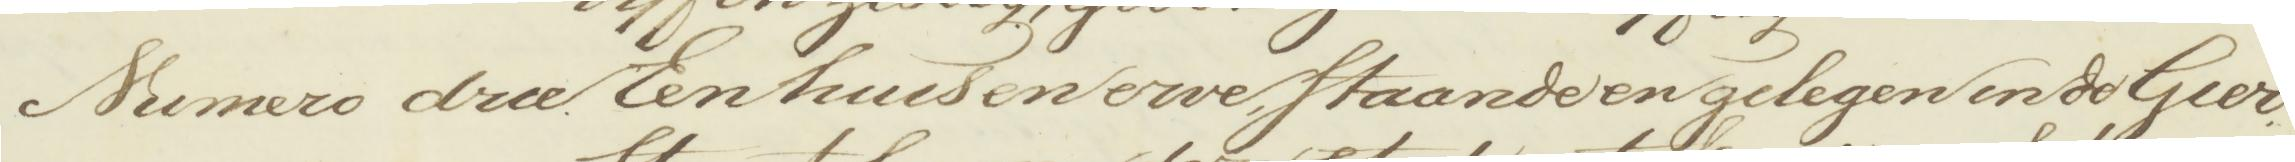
Numero drie Een huis en erve, staande en gelegen in de Gier„
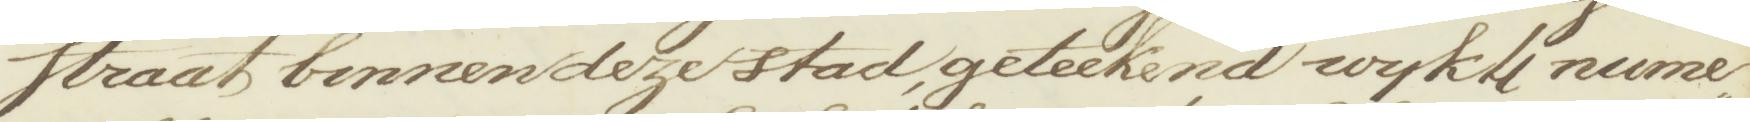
straat binnen deze stad, geteekend wyk 4 nume
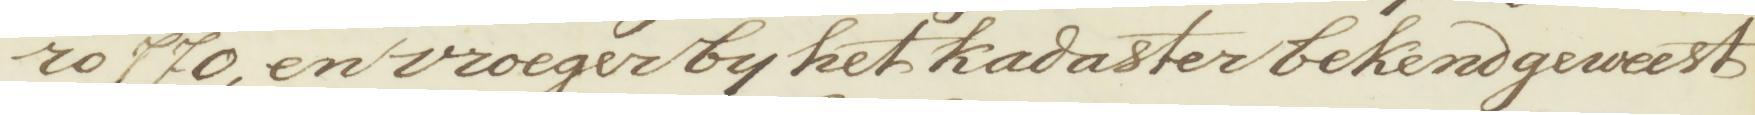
ro 770, en vroeger by het kadaster bekend geweest
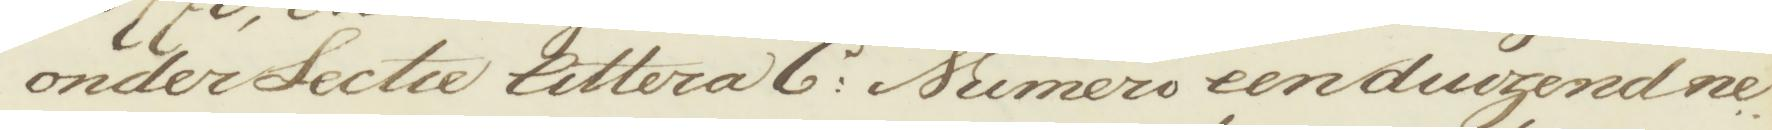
onder sectie littera C: Numero een duizend ne„
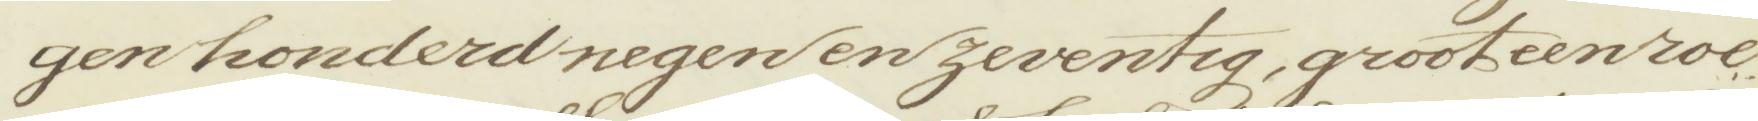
gen honderd negen en zeventig, groot een roe„
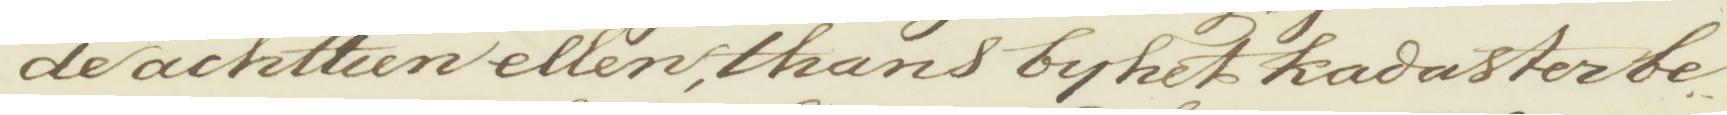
de achttien ellen, thans by het kadaster be„
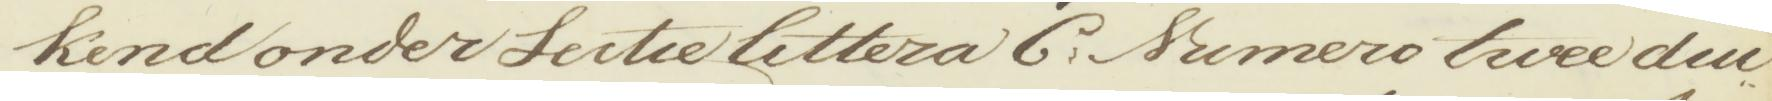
kend onder sectie littera C: Numero twee dui„
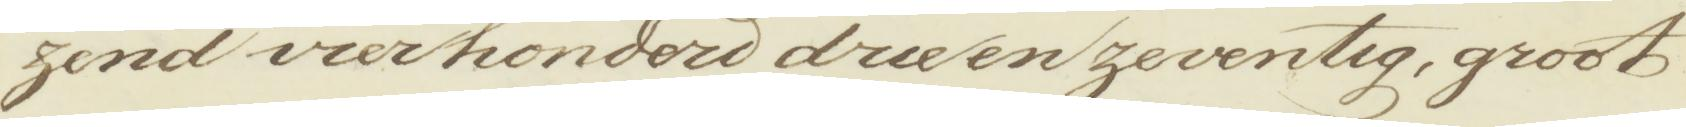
zend vier honderd drie en zeventig, groot
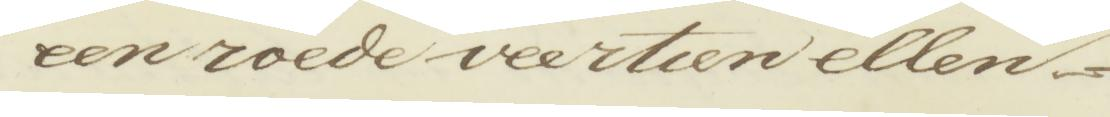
een roede veertien ellen.—
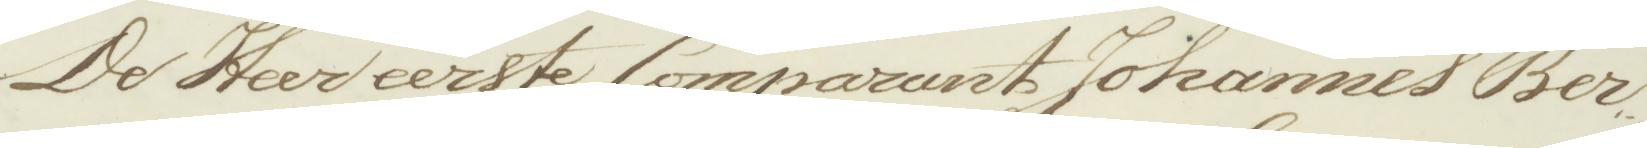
De Heer eerste Comparant Johannes Ber„
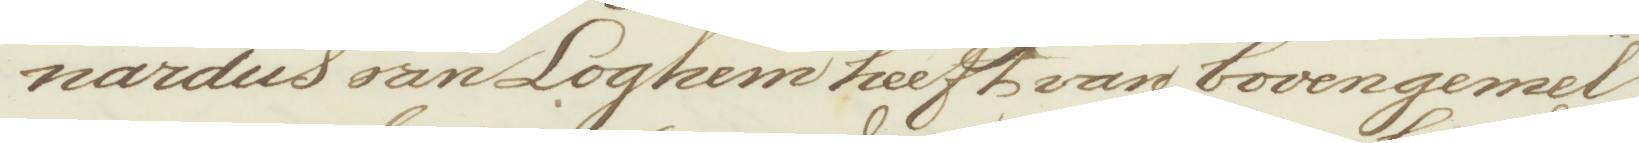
nardus van Loghem heeft van bovengemel
